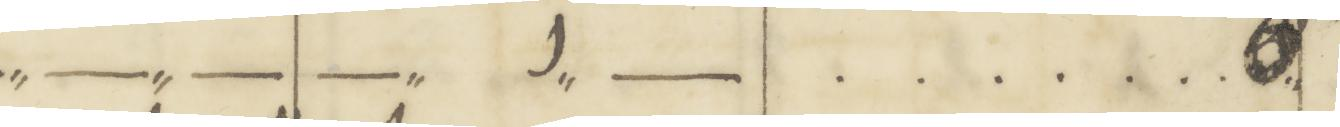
„ —„ — —„ 1„ — . . . . . . . 6„
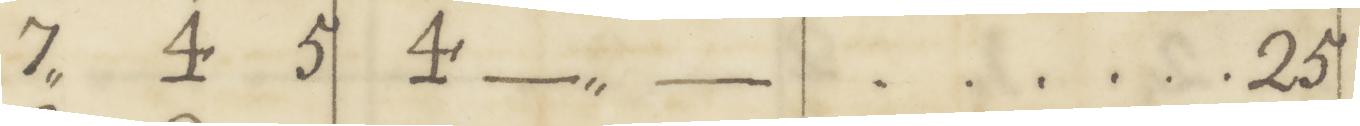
7„ 4 5 4 —„ — . . . . . . 25
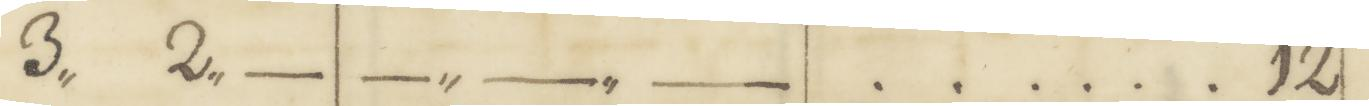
3„ 2„ — —„ —„ — . . . . . . 12
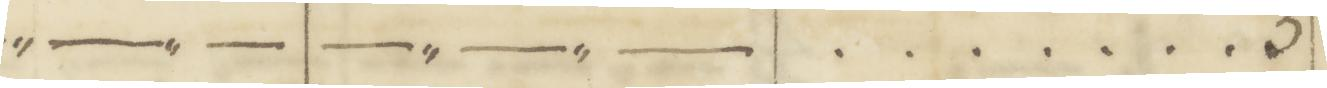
„ —„ — —„ —„ — . . . . . . . 5
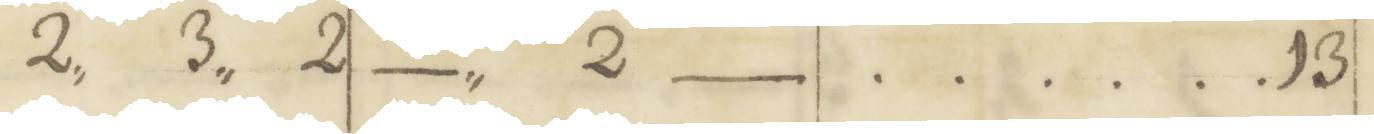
2„ 3„ 2 —„ 2 — . . . . . . 13
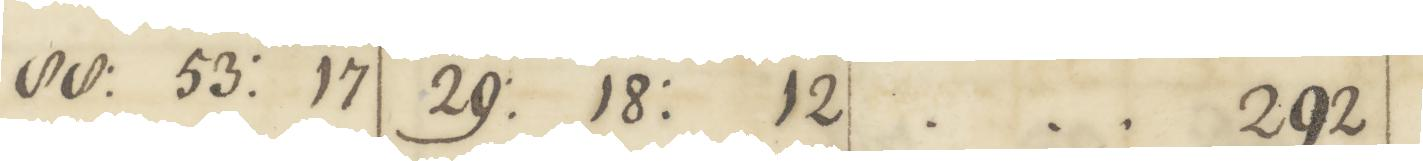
88: 53: 17 29: 18: 12 . . . 292
